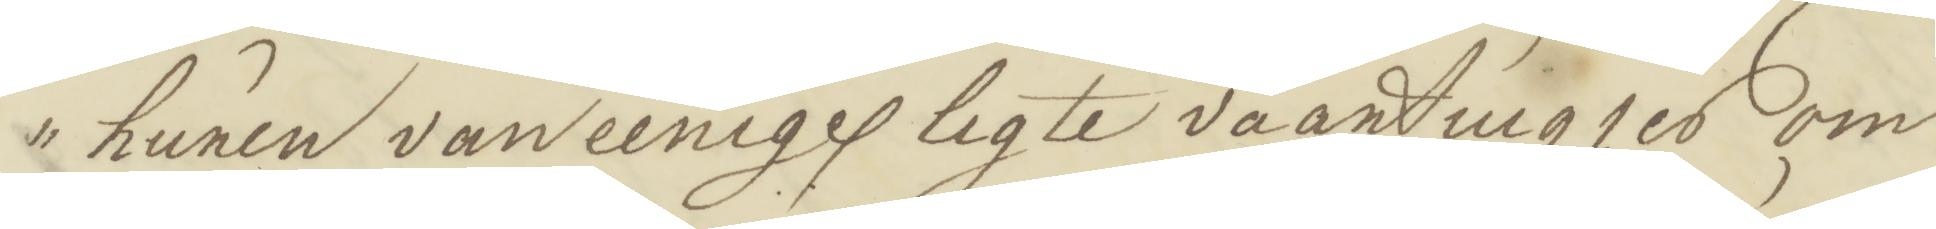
„huren van eenige ligte vaartuigjes, om
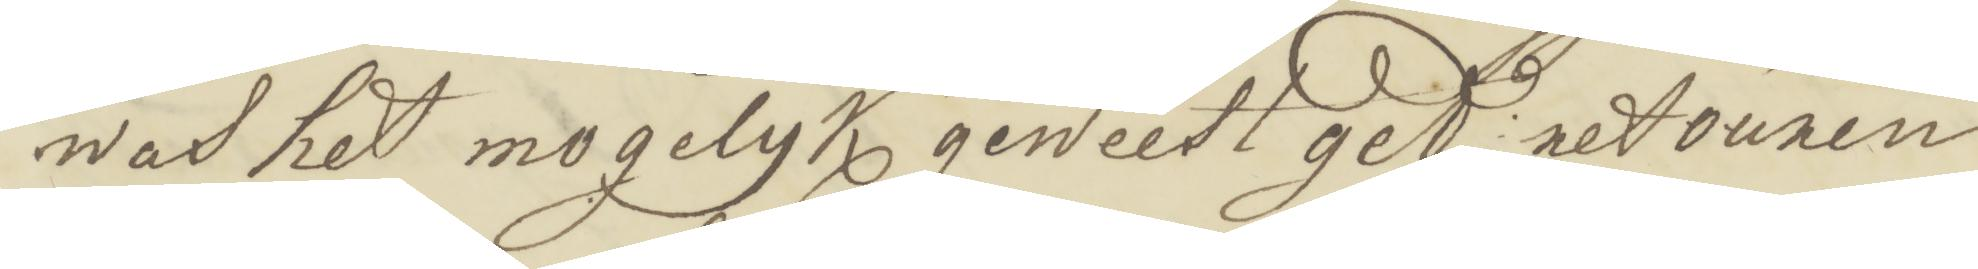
was het mogelijk geweest ged:e retouren
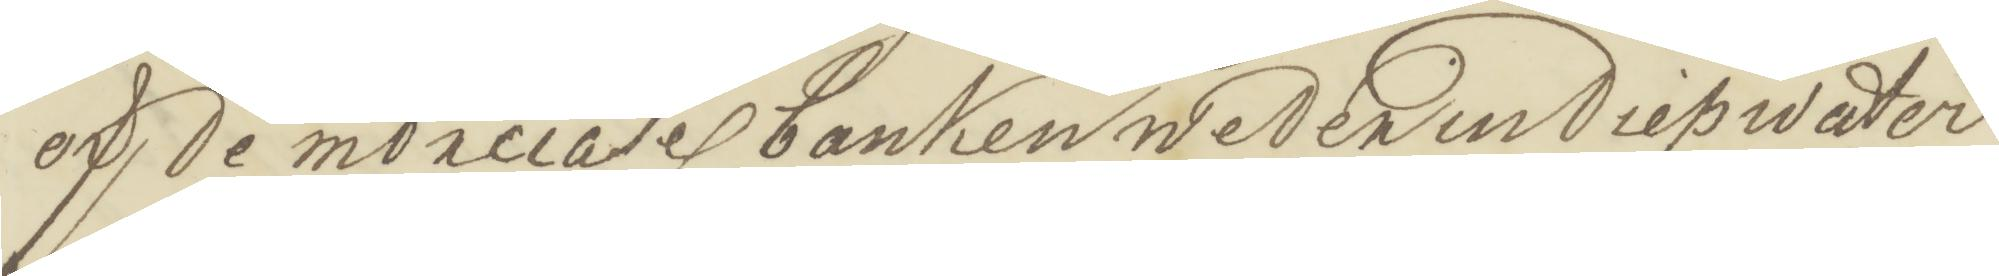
over de morciase banken weder in diep water
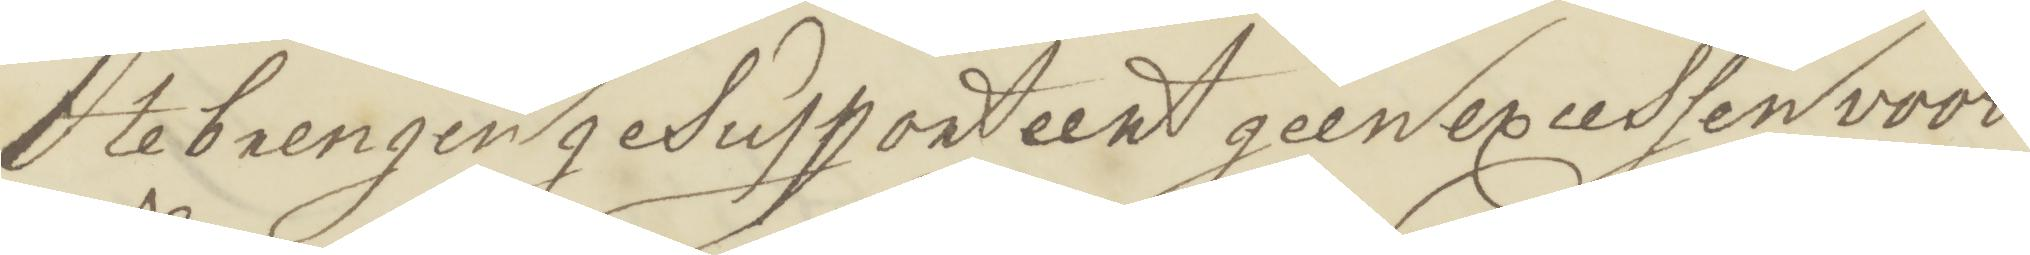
te brengen gesupporteert geen excessen voor
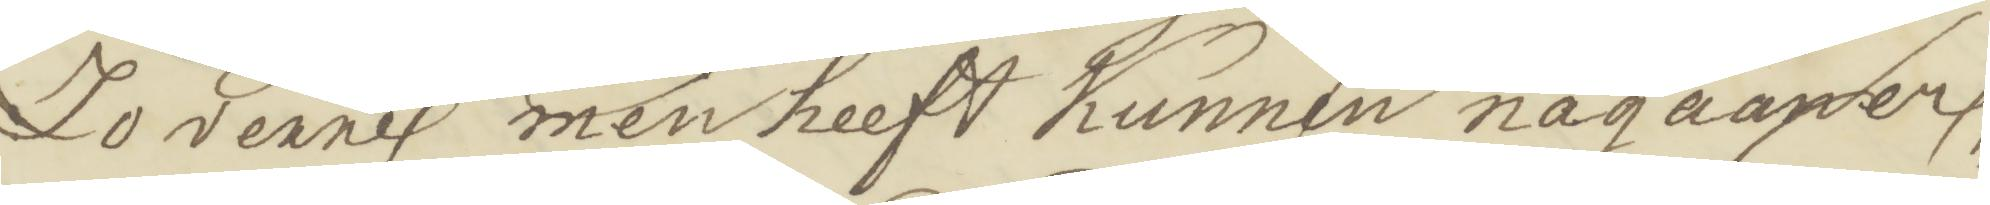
Zo verre men heeft kunnen nagaan er
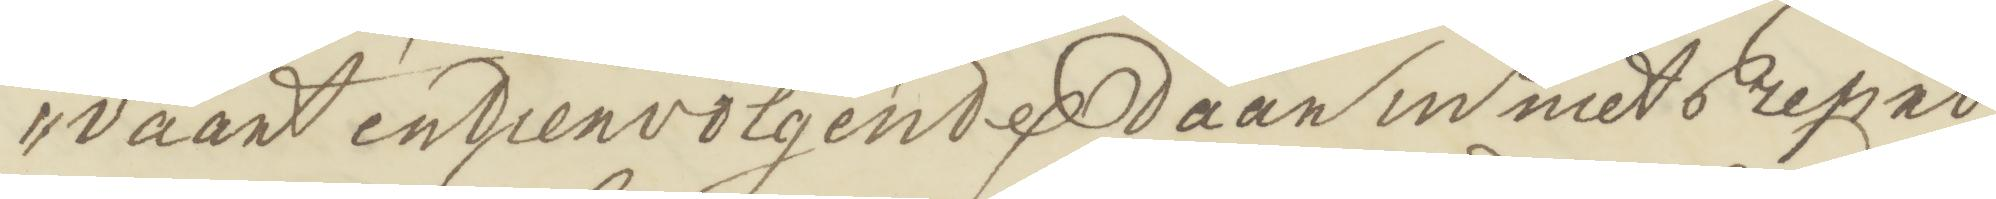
„vaart en dienvolgende daar in niets repro
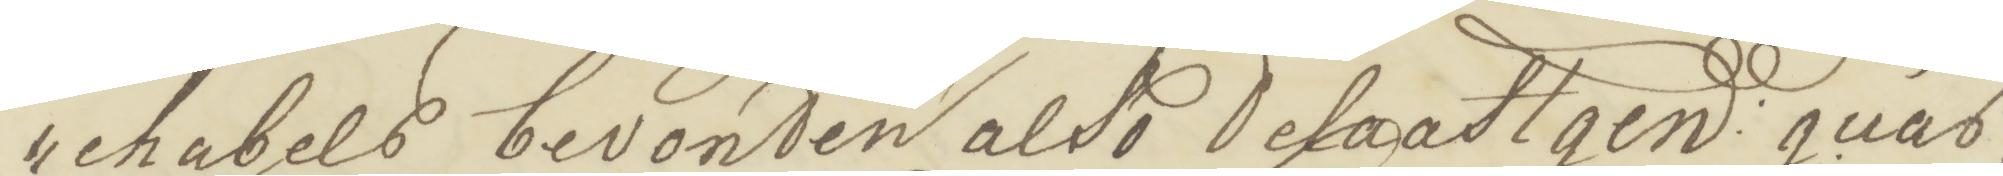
„chabels bevonden also de laast gen:e guas
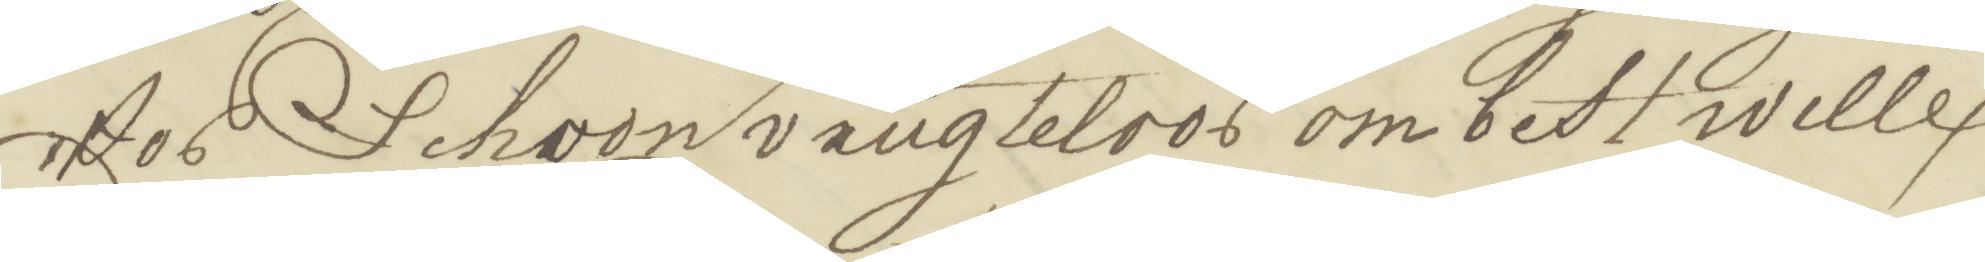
tos Schoon vrugteloos om best wille
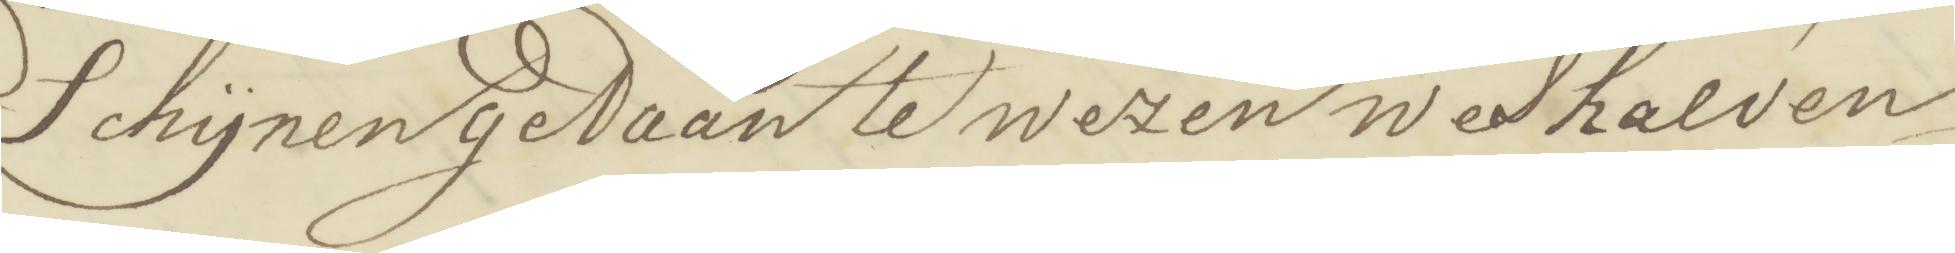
Schijnen gedaan te wezen weshalven
